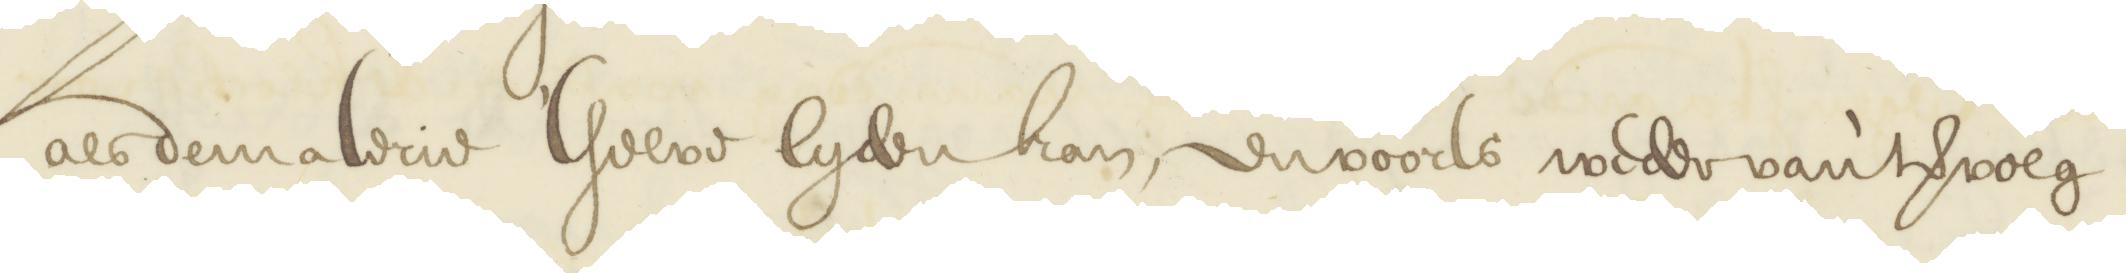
als dematerie 'tselve lyden kan, en voorts weder van 't vervolg
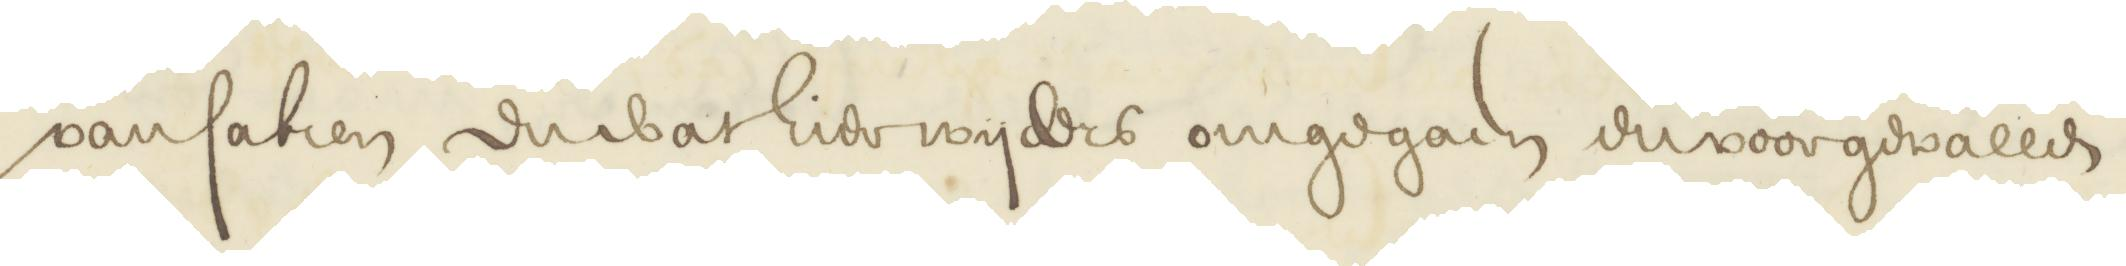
van saken en wat hier wijders omgegaen envoorgevallen
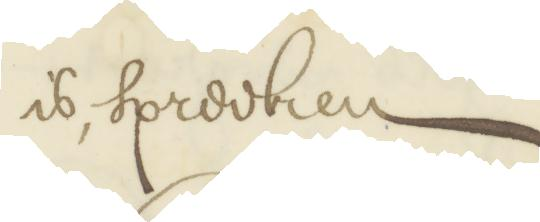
is, spreeken.
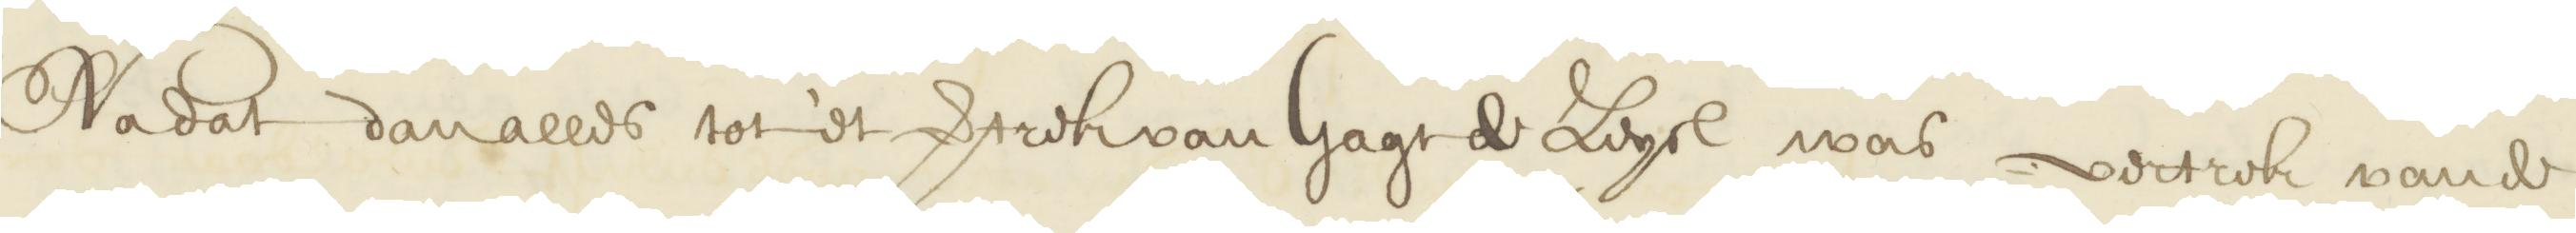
Nadat dan alles tot ’et vertrek van tjagt de Zeyl was vertrek van de
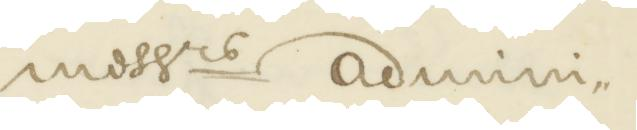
mess=rs Admini„
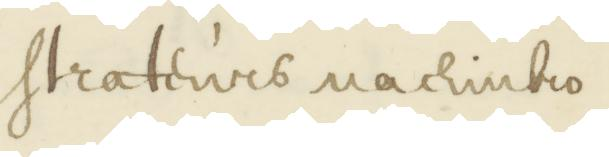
strateurs nachinko
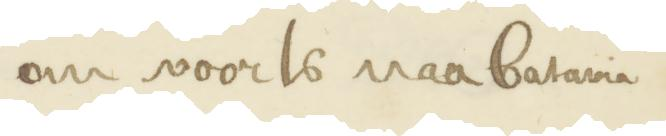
om voorts naa batavia
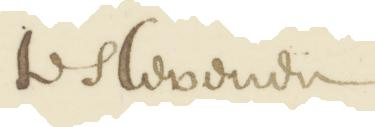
te stevenen
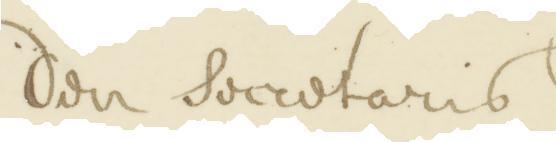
den secretaris
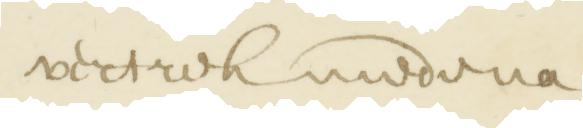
vertrek mede na
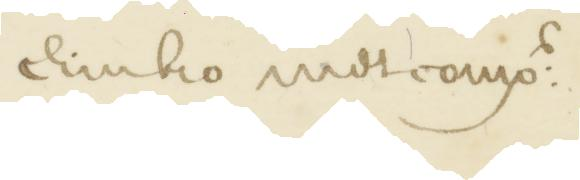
chinko met comp:s
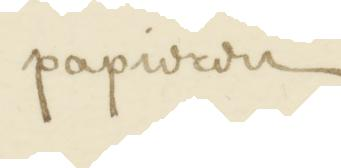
papieren.
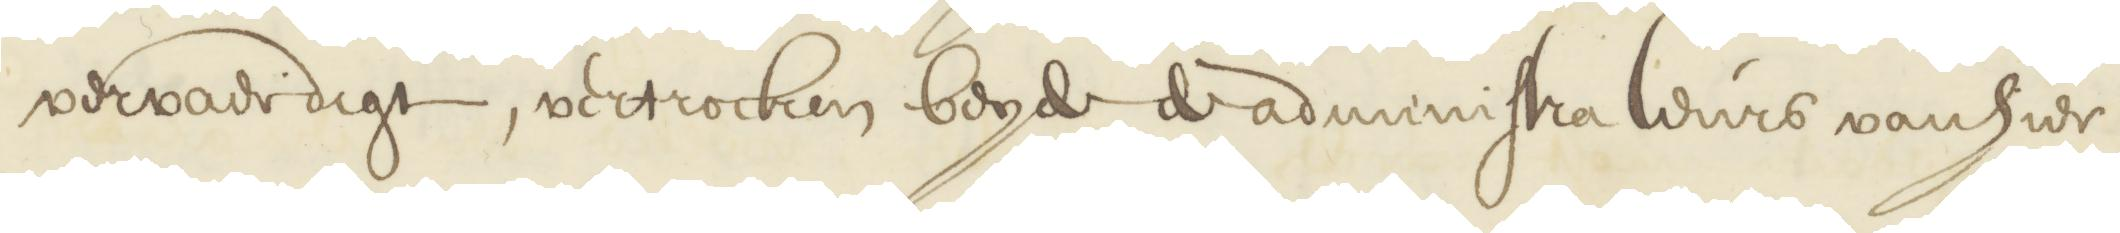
vervaerdigt, vertrocken beyde de administrateurs van hier
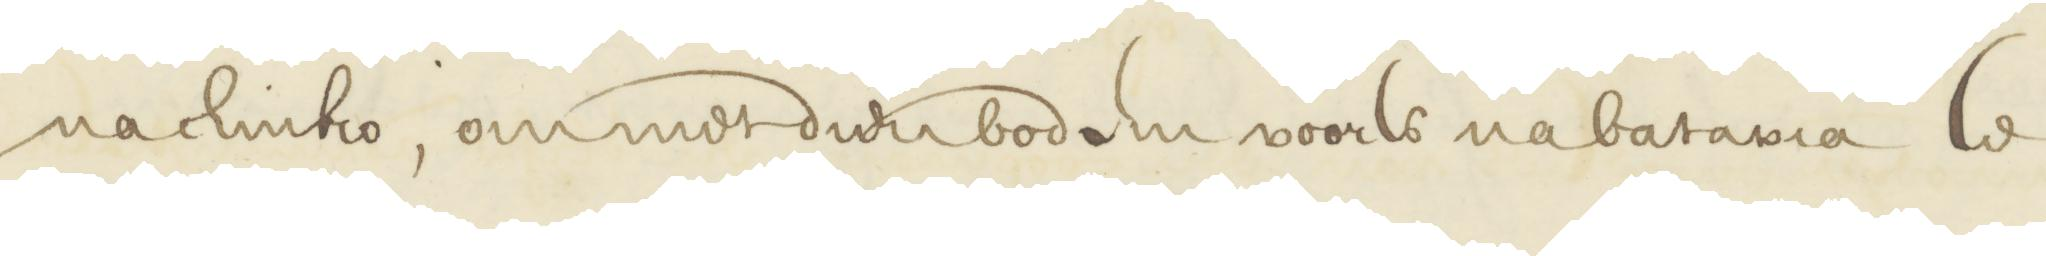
na chinko, om met dien bodem voorts na batavia te
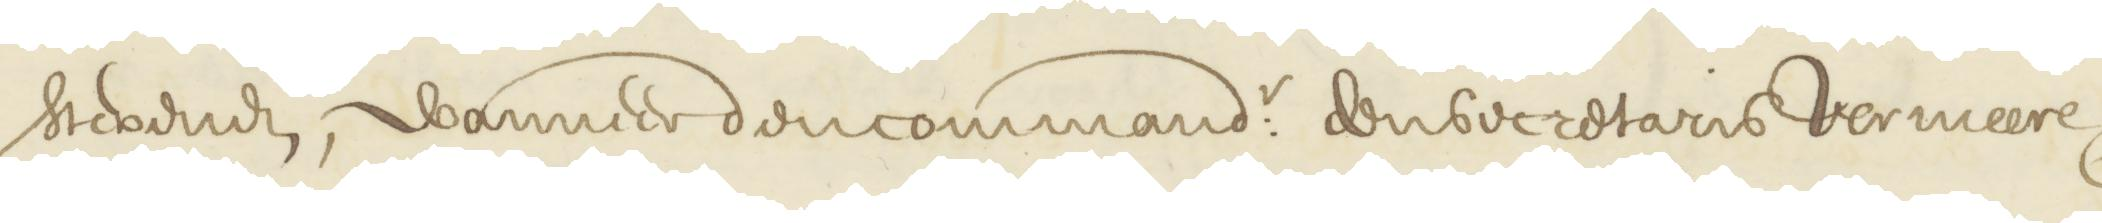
stevenen, wanneer den command:r den secretaris Vermeere
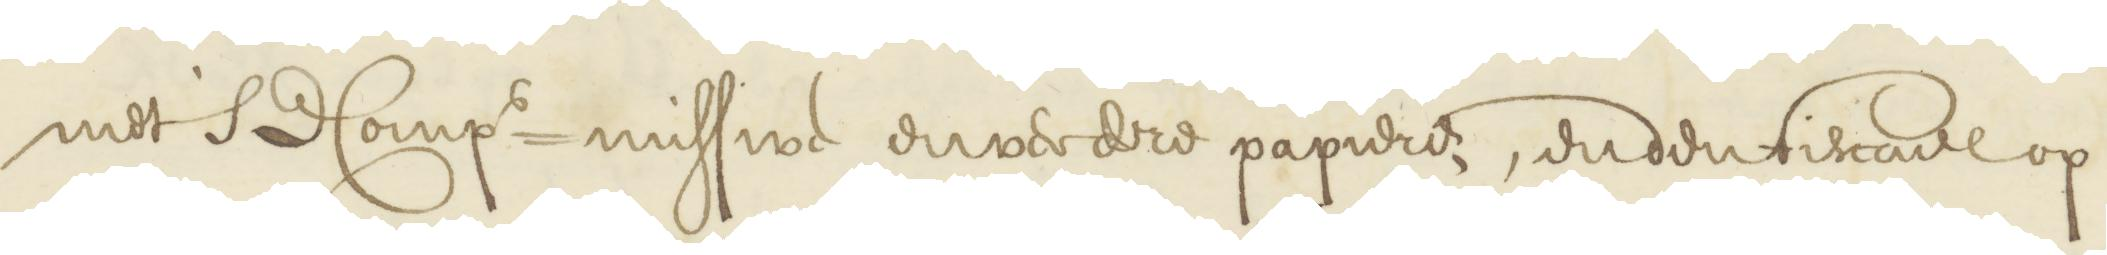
met ’s E Comp=s missive en verdere papieren, en den fiscael op
